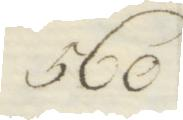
560
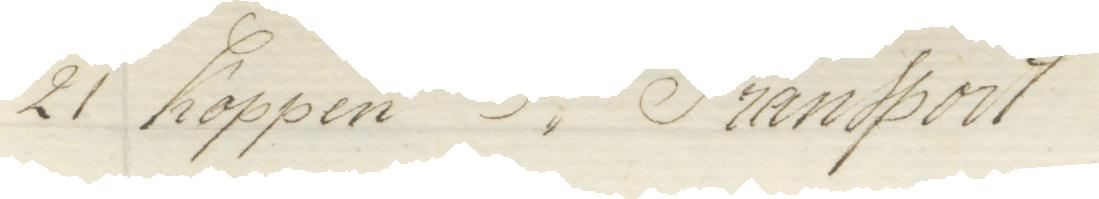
21 koppen P„r Transport
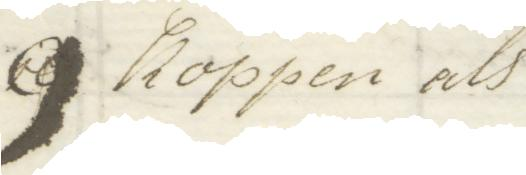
9 koppen als
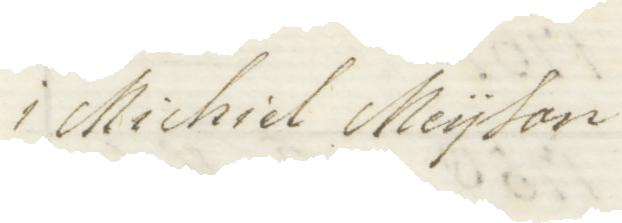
1 Michiel Meijson
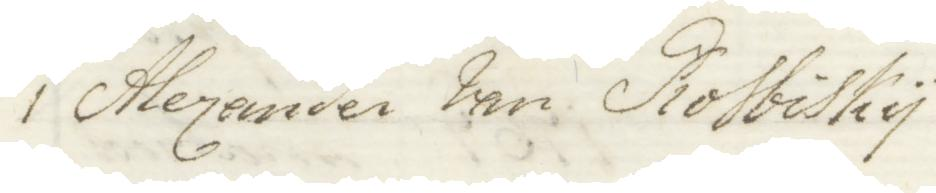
1 Alexander van Rosbiskij
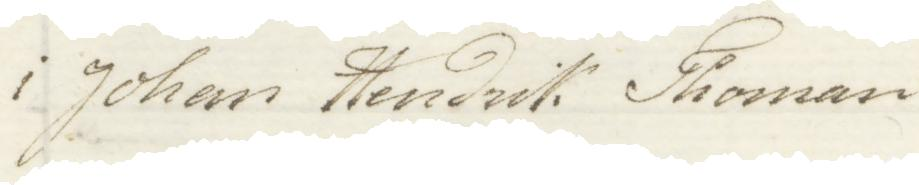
1 Johan Hendrik Thoman
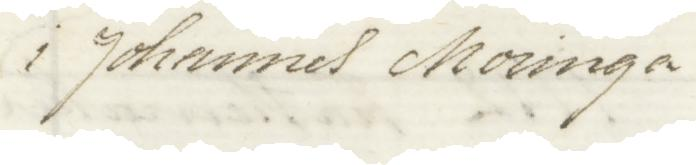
1 Johannes Moringa
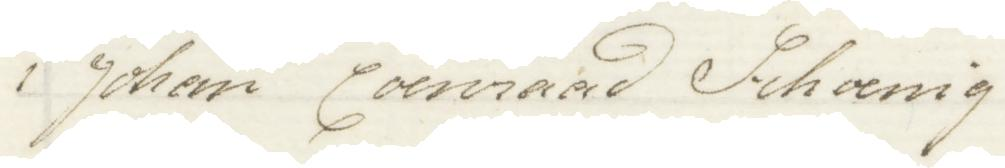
1 Johan Coenraad Schoenig
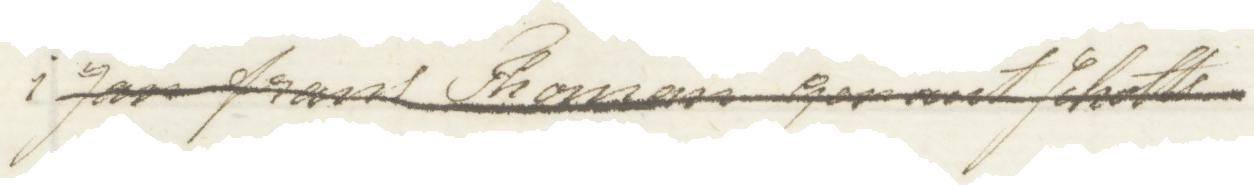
1 Jan frans Thoman Genaut scholte
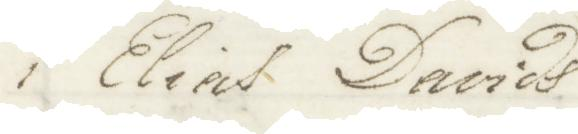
1 Elias Davids
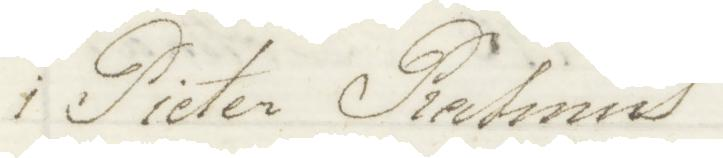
1 Pieter Prasinus
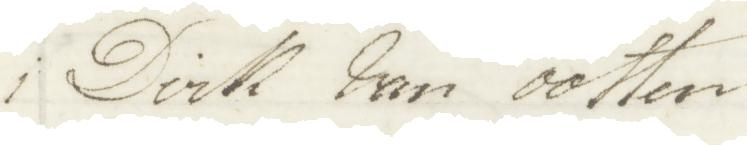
1 Dirk van oosten
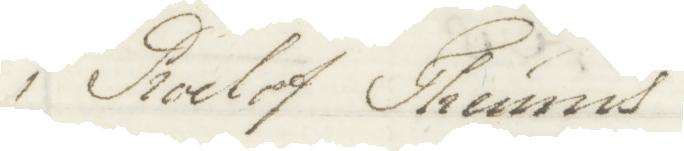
1 Roelof Theunis
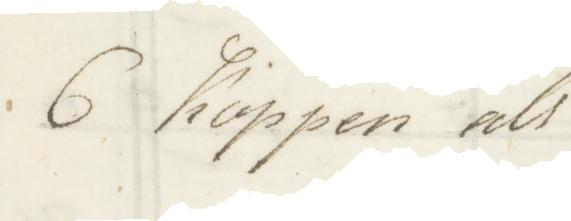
6 koppen als
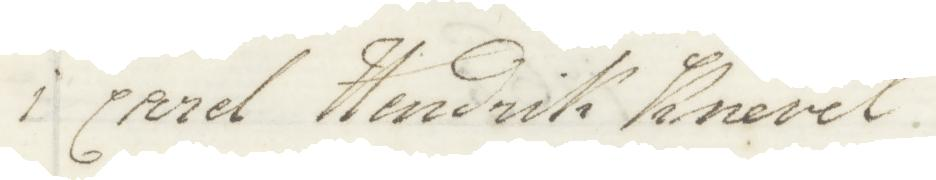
1 Carel Hendrik Knevel
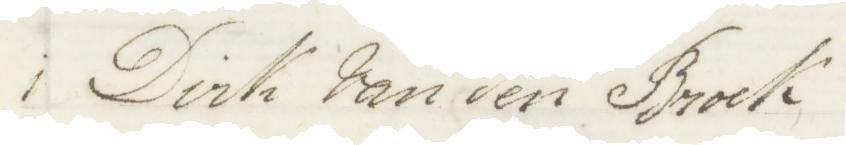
1 Dirk van den Broek
